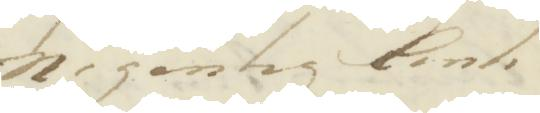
negentig Cent
